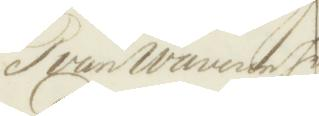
P van WaverenJr
